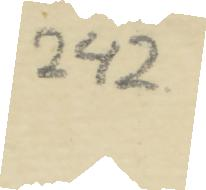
242.
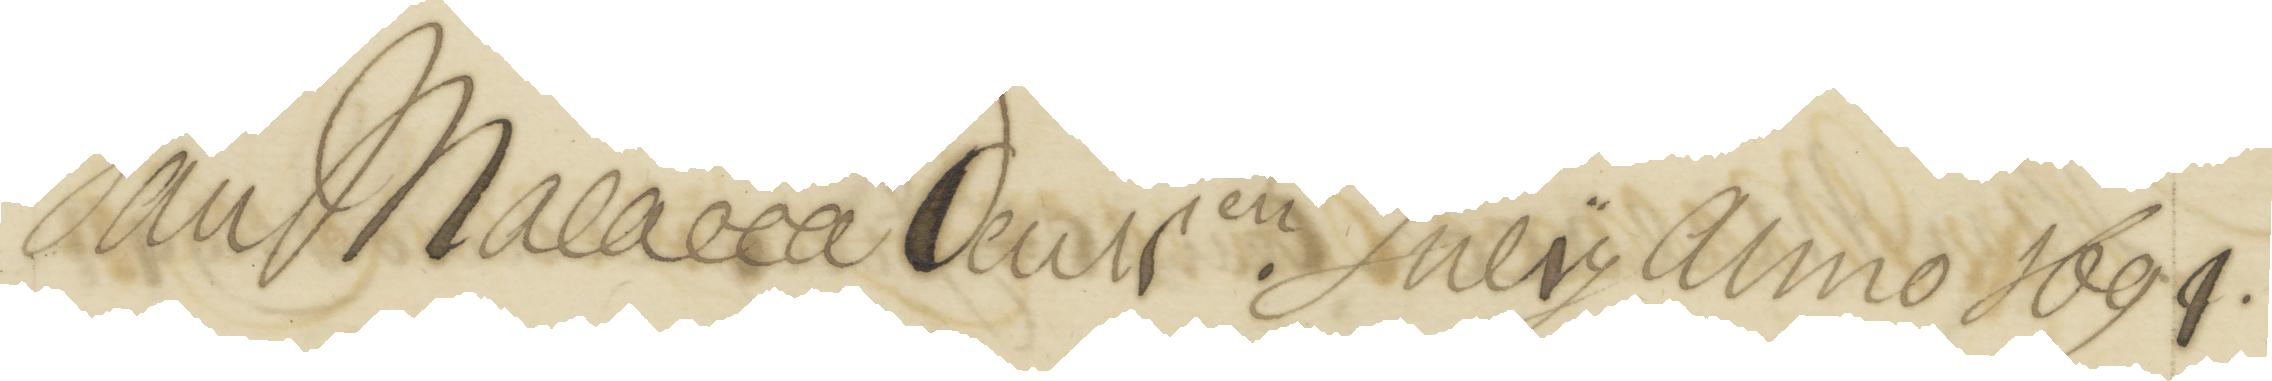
Van Mallacca den 15.en Julij anno 1694.
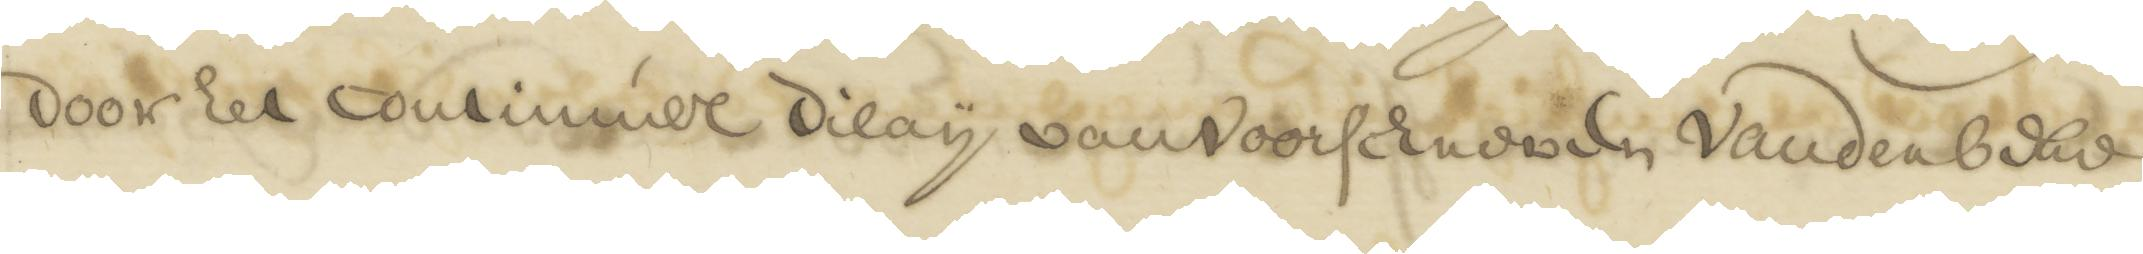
door het continueel dilaij van voorschreven van der beke
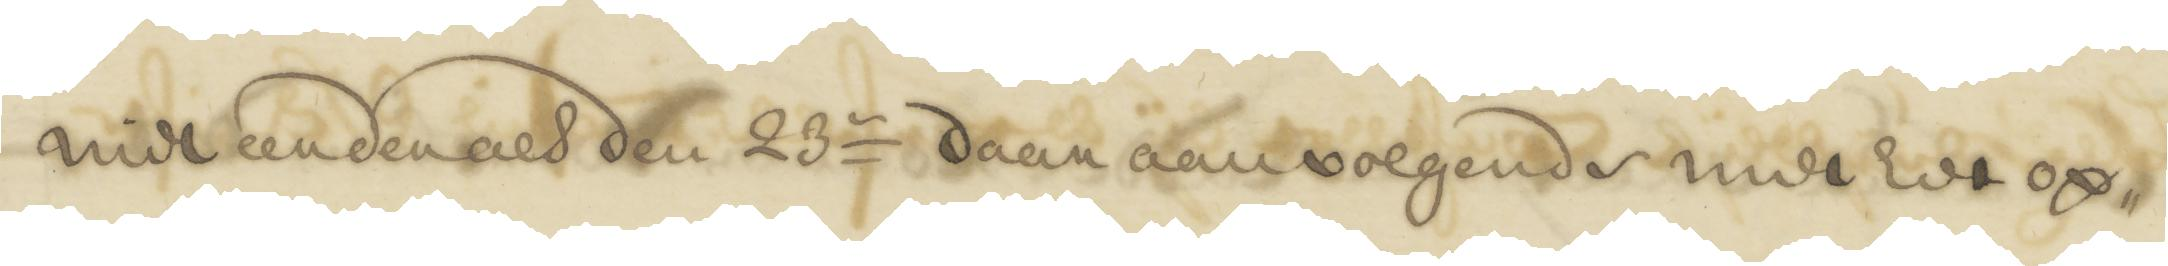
niet eerder als den 23=n daar aan volgende met het op„
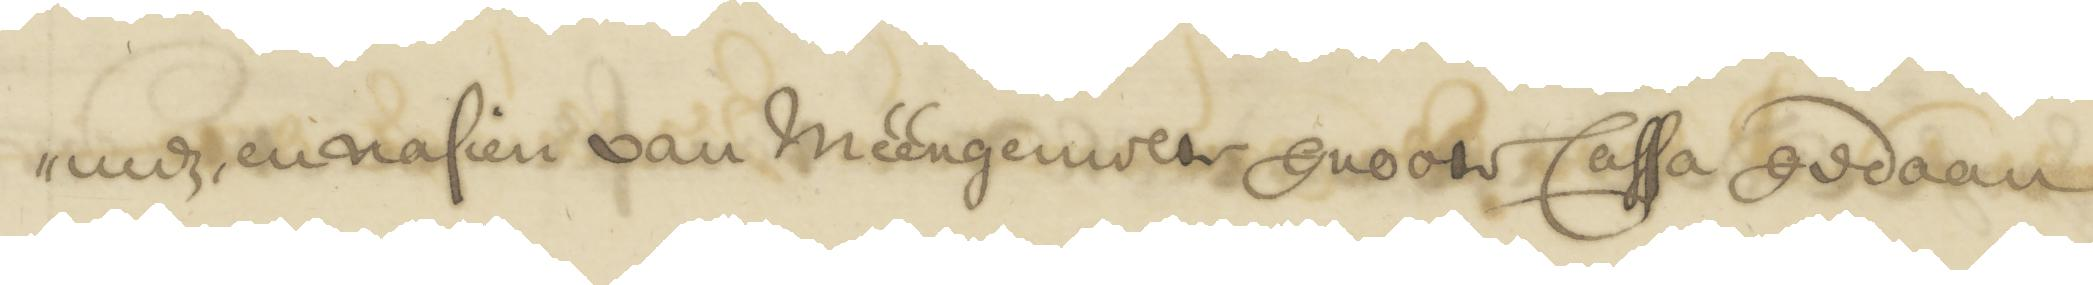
„nen, en nasien van meergemelte groote Cassa gedaan
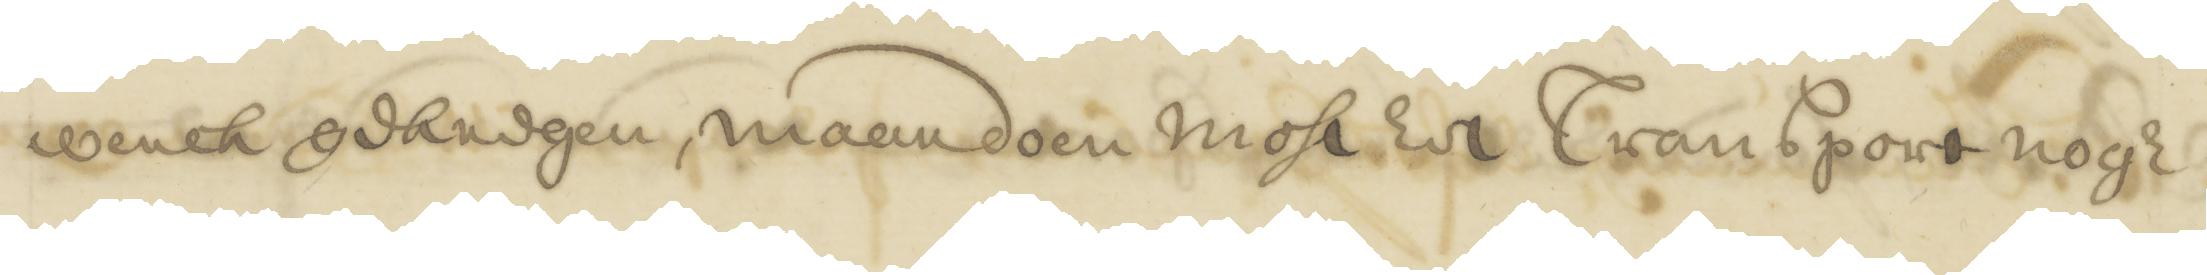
werck gekregen, maar doen most het Transport nogh
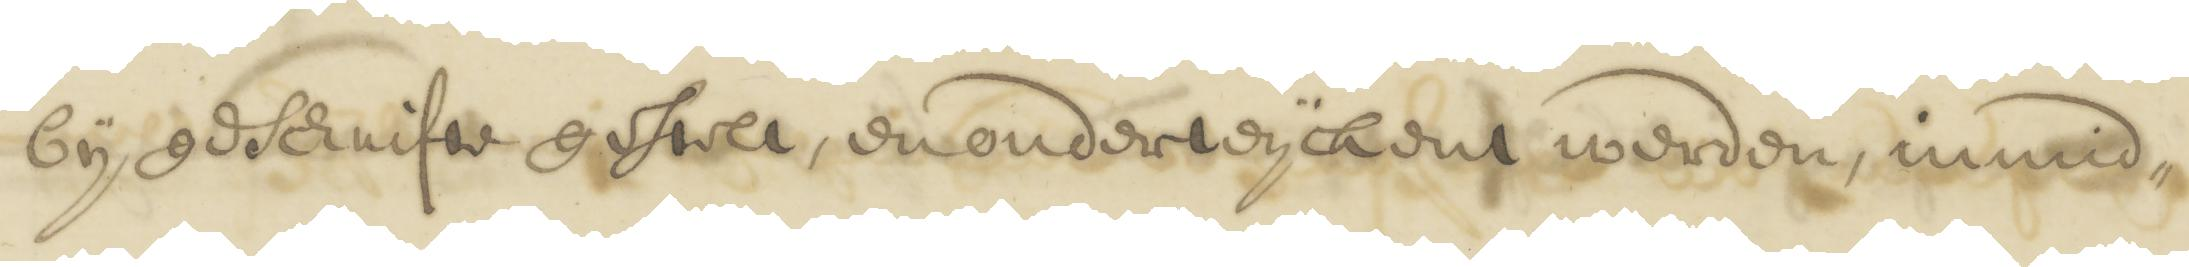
bij geschifte gestelt, en onderteijckent werden, in mid„
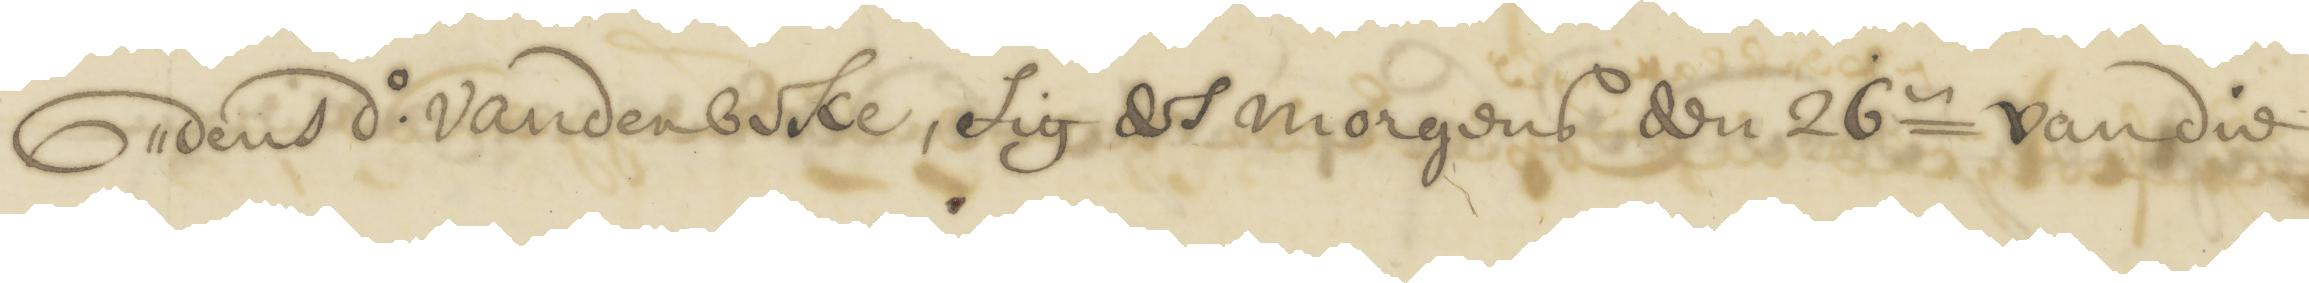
„dens d.o van der beke, sig des morgens den 26=n van die
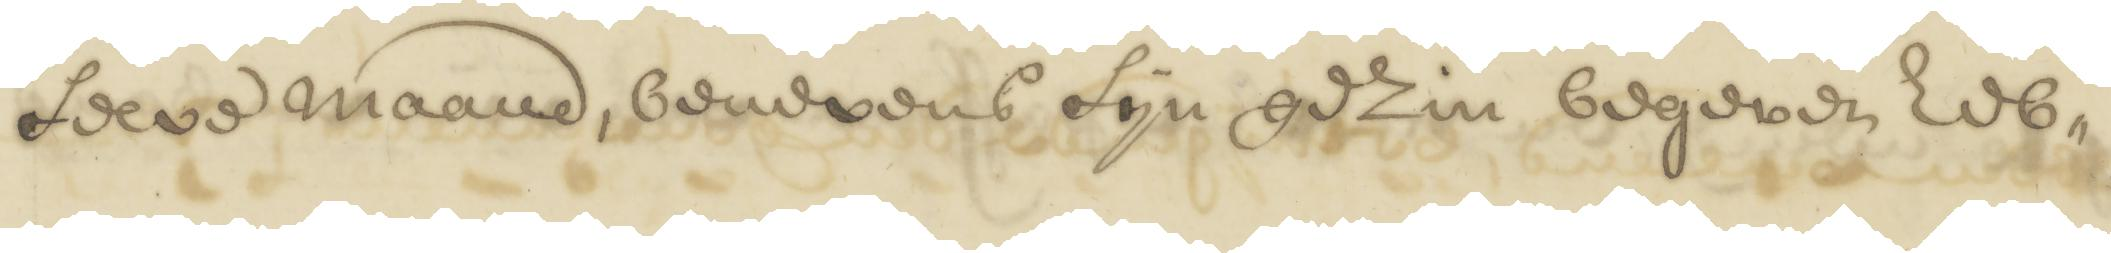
selve maand, benevens sijn gezin begeven heb„
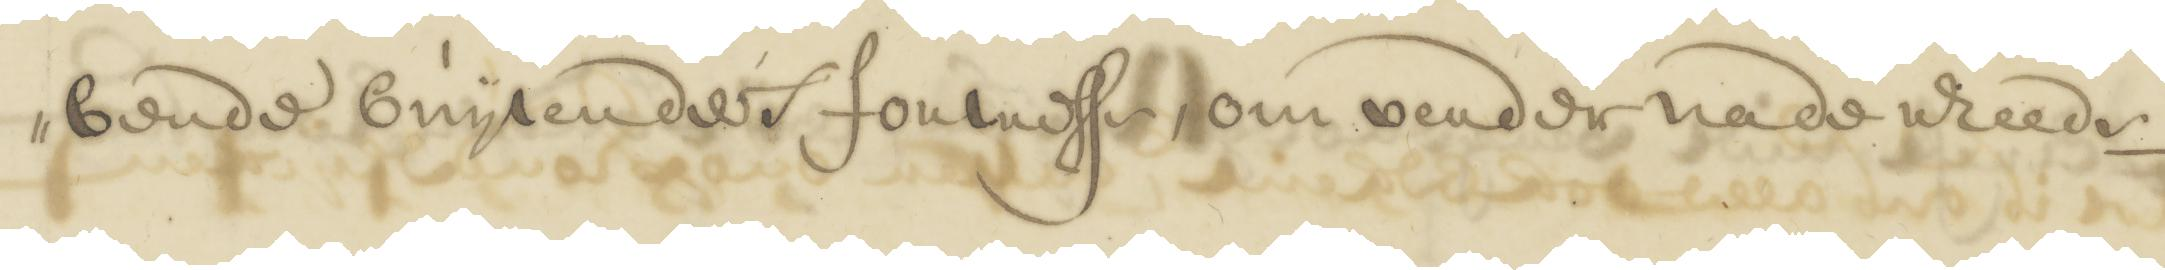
„bende buijten dies fortresse, om verder na de rheede
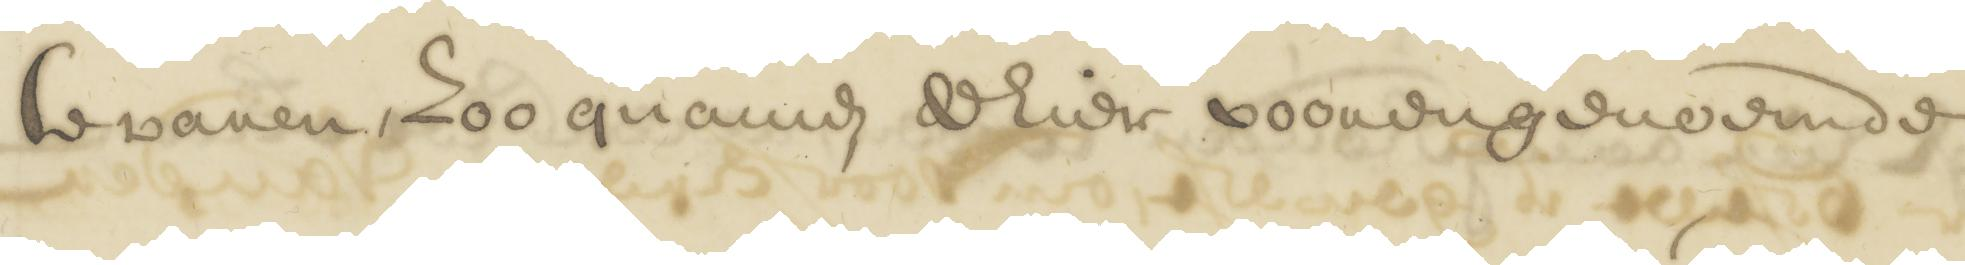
te varen, zoo quamen de hier vooren genoemde
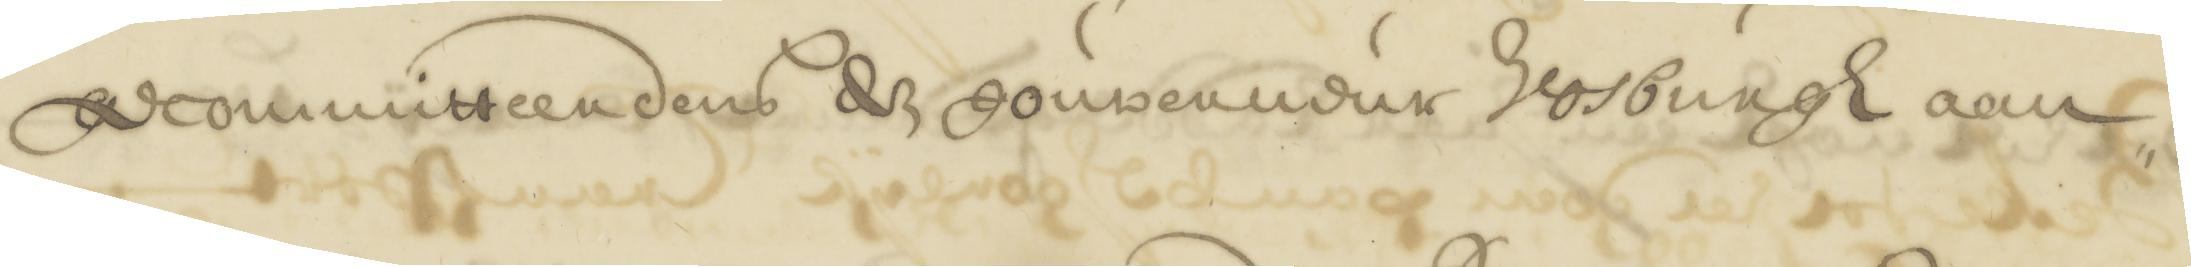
gecommitteerdens den gouverneur Vosburgh aan„
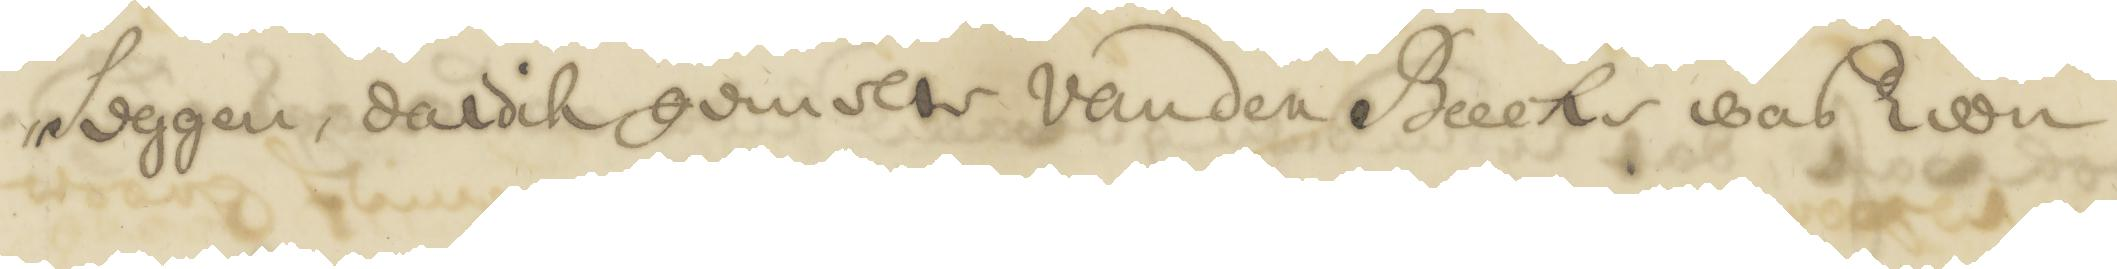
„seggen, dat dik gemelte van der Beeeke was heen
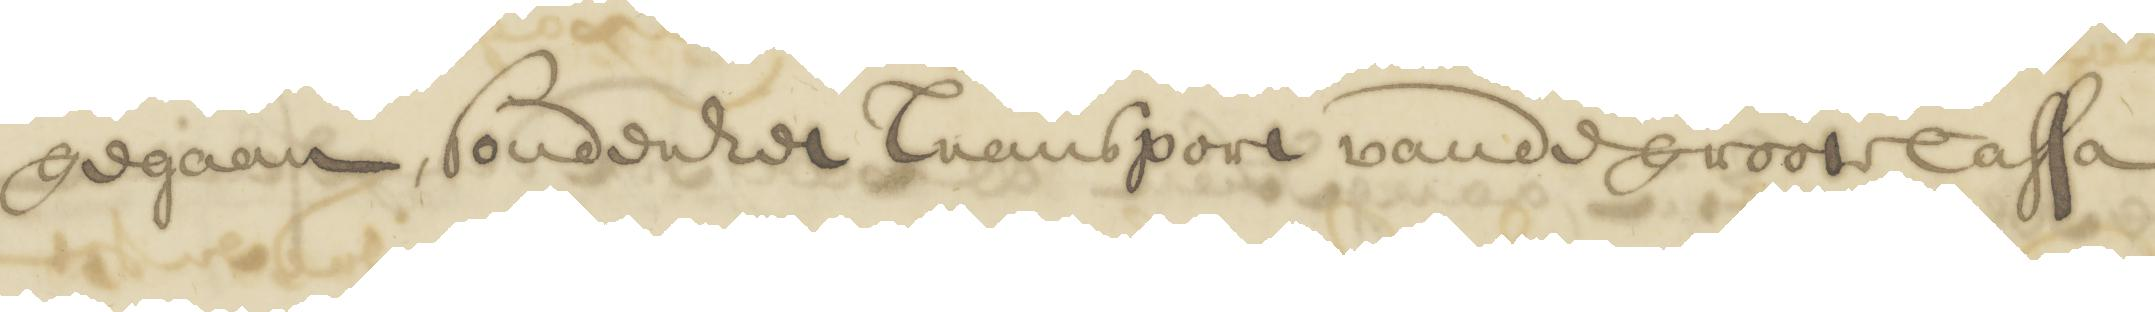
gegaan, sonder het transport van de groote Cassa
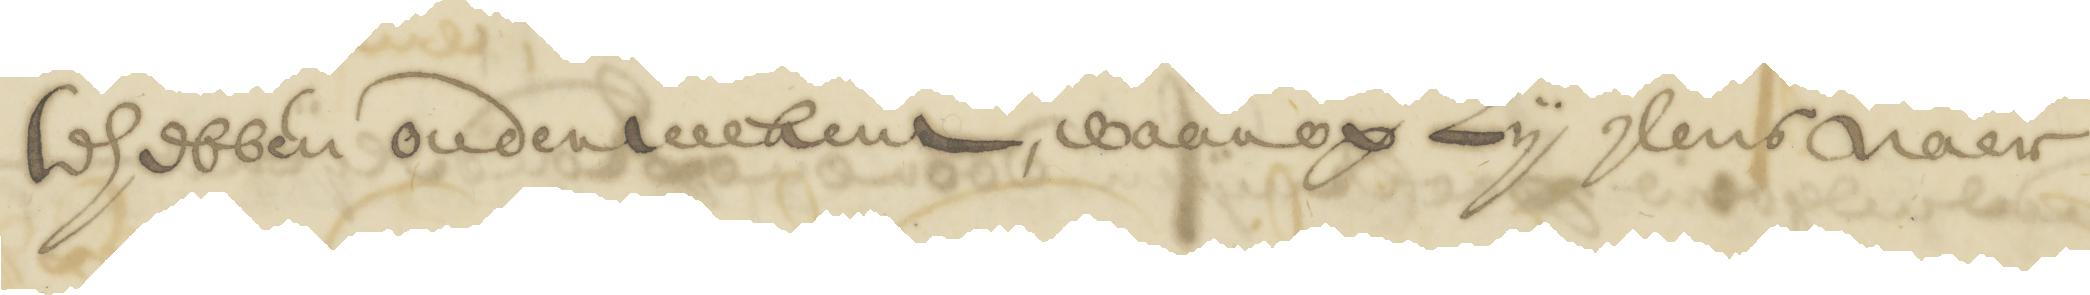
tehebben onderteeekent, waarop zij ijlens naer
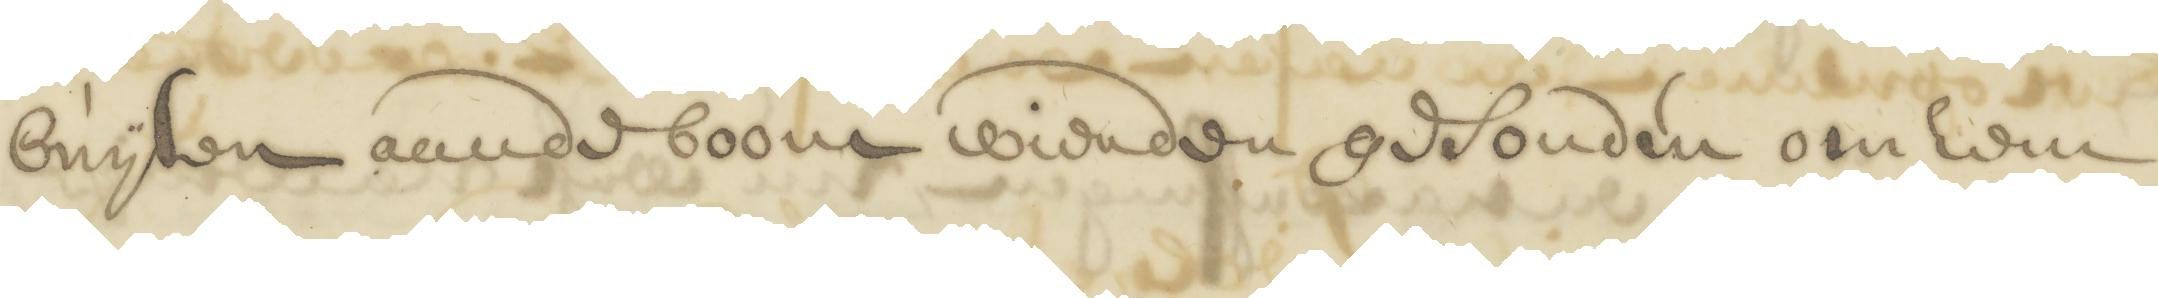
buijten aan de boort wierden gesonden om hem
